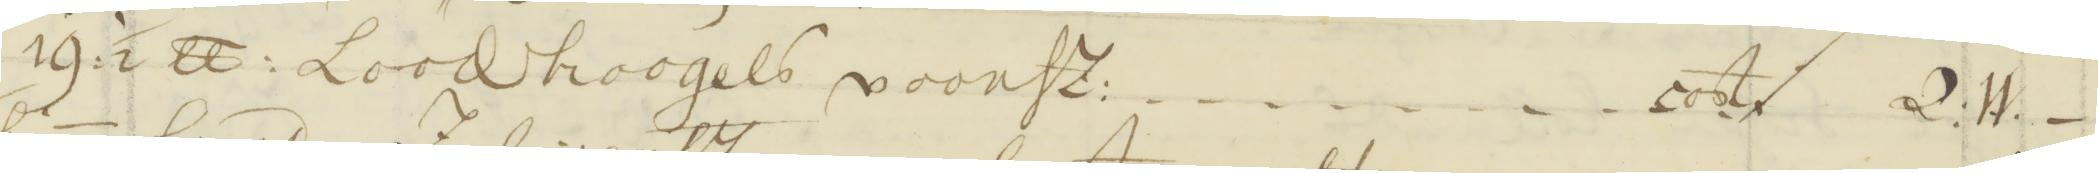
19:½ lb: Loode koogels voorsz: - - - - - - - - cost f 2: 11:—
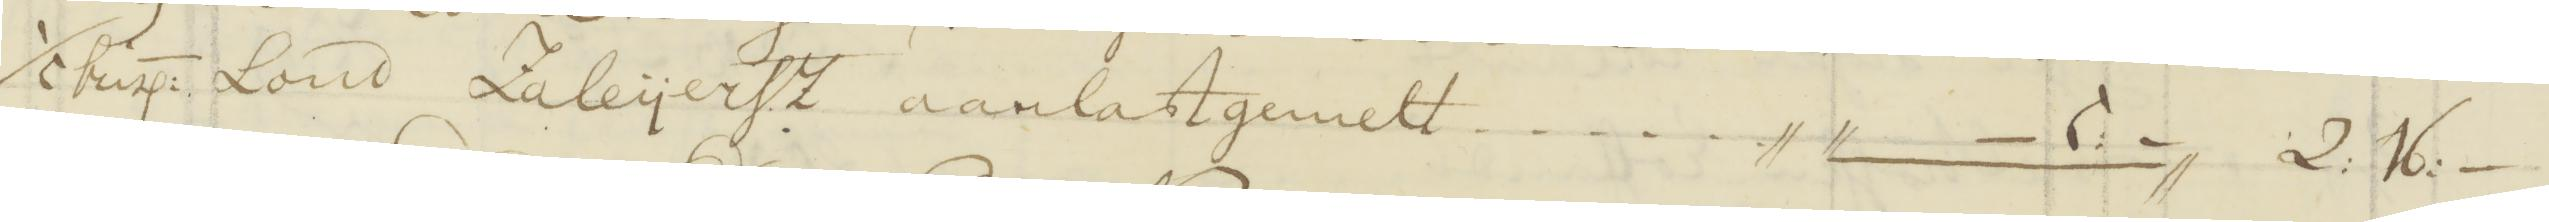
1/5 kip: Lond zaleijersz aanlastgemelt - - - - - .„ „ — 5:- „ 2: 16:—
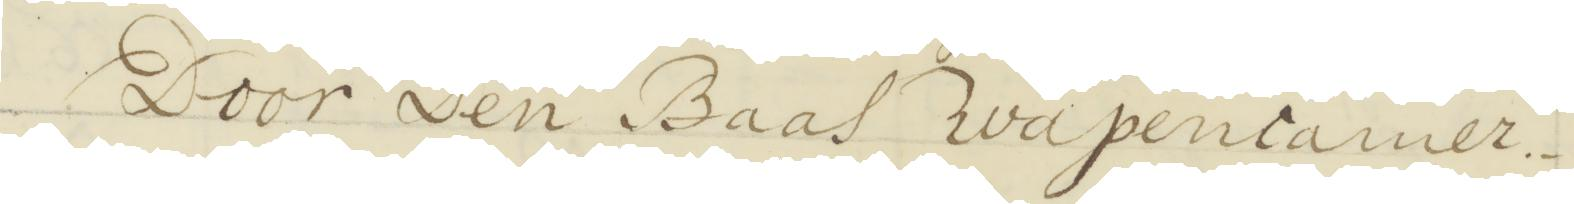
Door Den Baas wapencamer.-
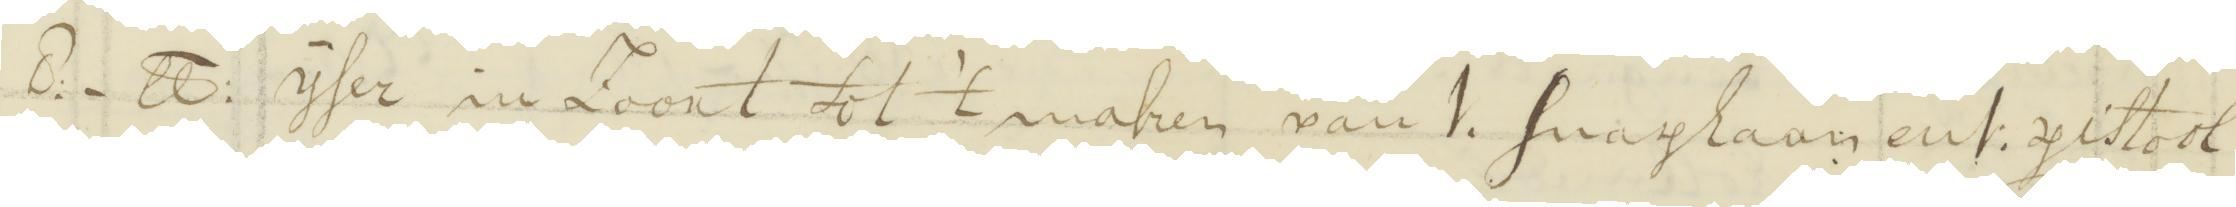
8.– lb: ijser in zoort tot ’t maken van 1. snaphaan en 1: pistool
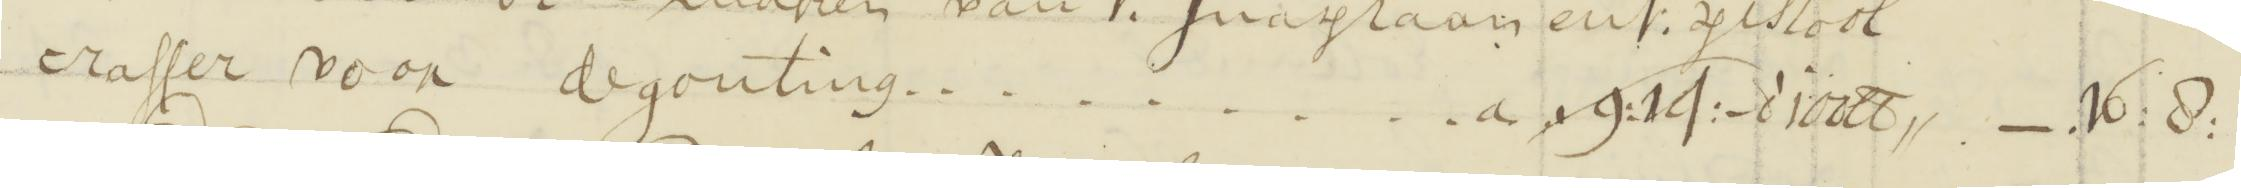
crasser voor degonting - - - - - - - - - a ƒ 9:14: - 't 100 lb„ —. 16: 8:
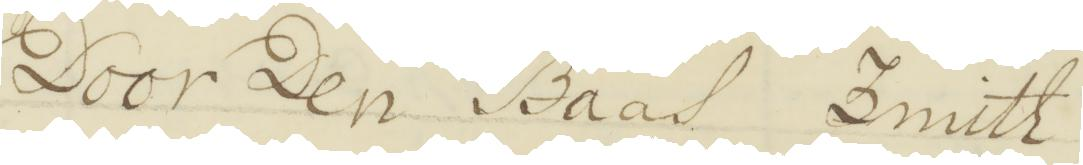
Door Den Baas Zmith
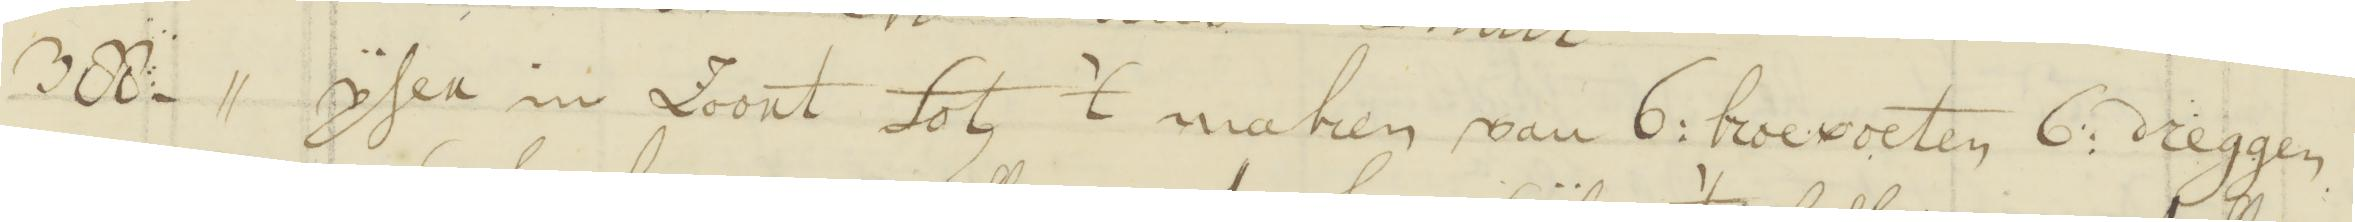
388:- „ ijser in zoort tot ’t maken van 6: koevoeten 6: dreggen
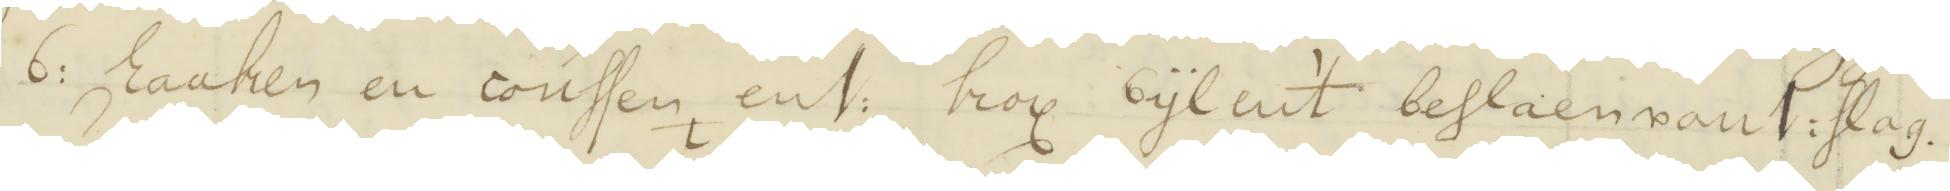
6: haaken en coussen en 1: kop bijl en't beslaen van 1: slag.
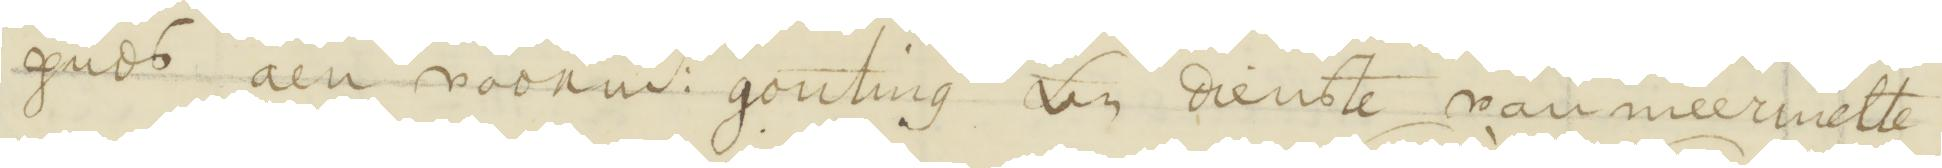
guds aen voorm:t gonting ten dienste van meermelte
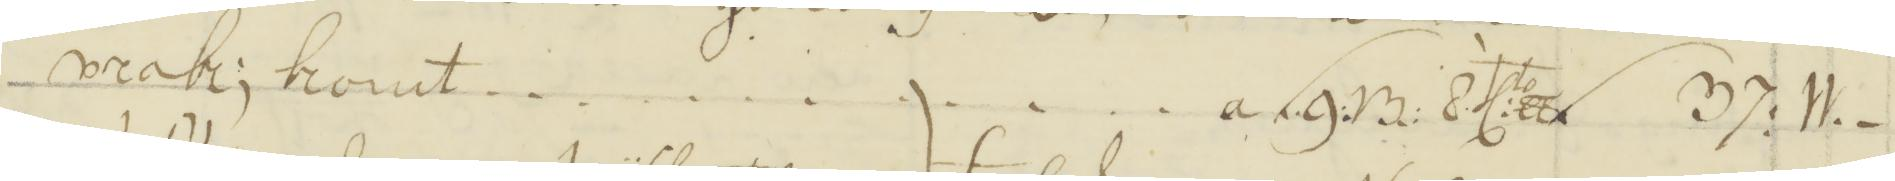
vrak; komt - - - . . . . . . - . . a ƒ. 9:13: 8 'tC:to lb f 37:11.-
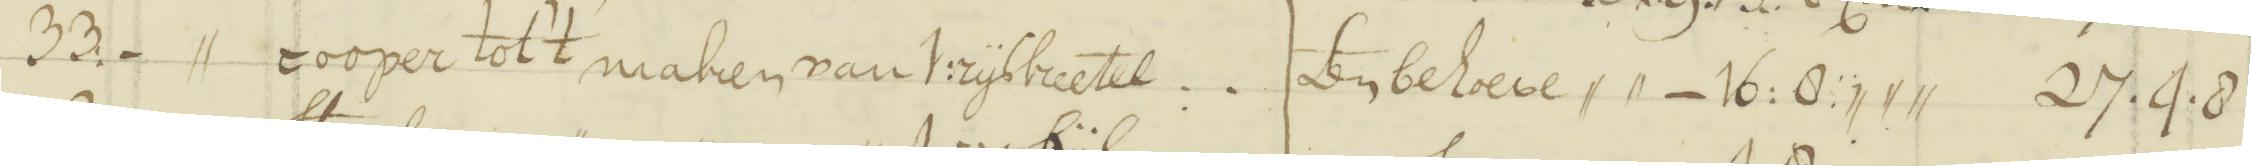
33 - „ cooper tot ’t maken van 1: rijskeetel .. ten behoeve „ „ — 16:8:„ „ „ 27.4.8
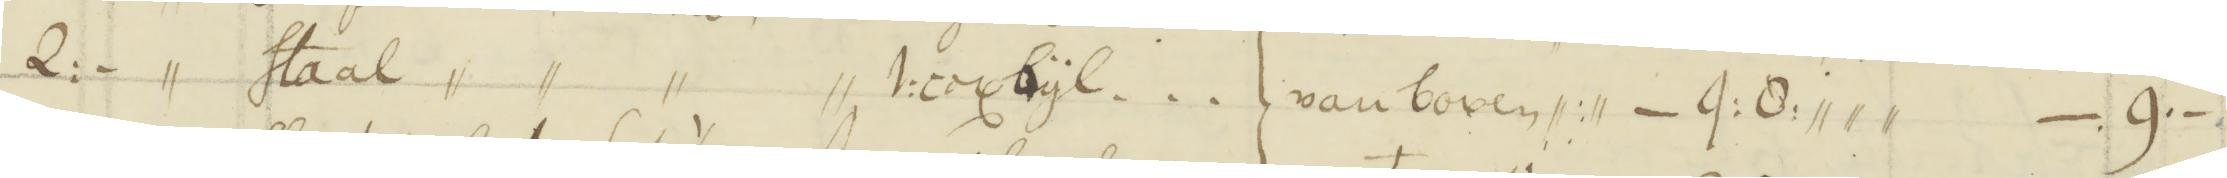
2: - „ staal „ „ „ „ 1:cox bijl .... van boven „ : „ - 4:8: „ „ „ — 9. — .
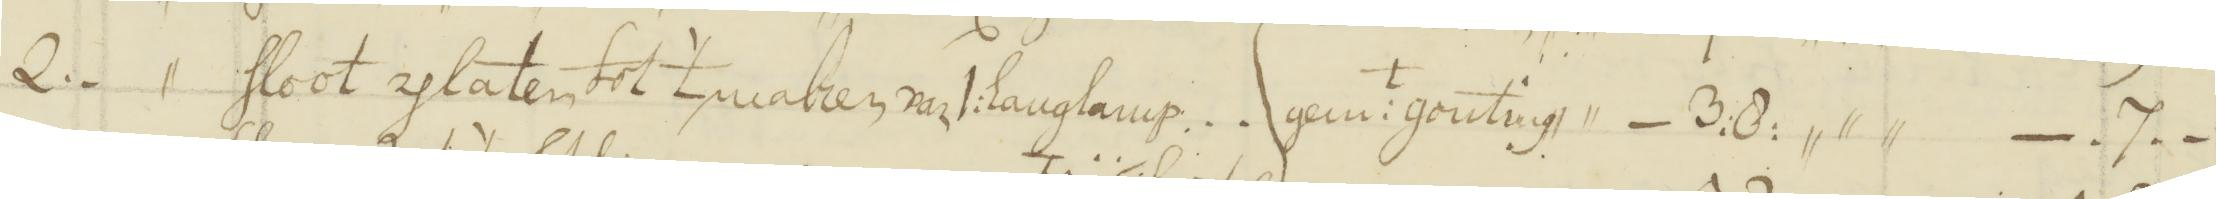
2: - „ sloot platen tot ’t maken van 1: hanglamp ... gem:t gonting „ — 3.8: „ „ „ — .7. —
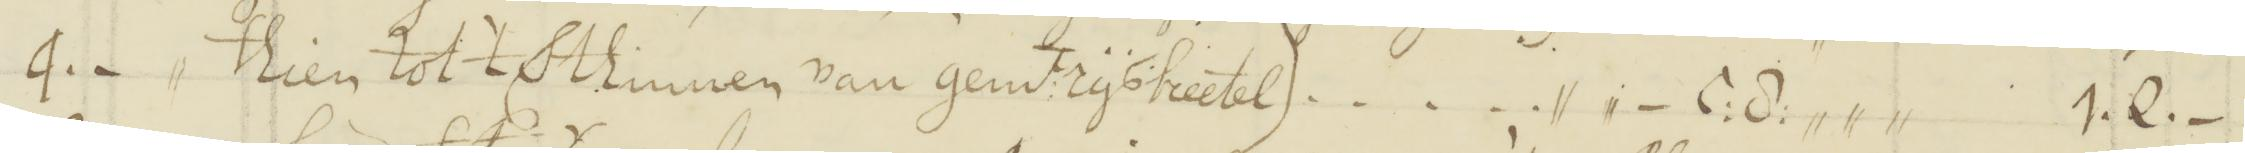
4. - „ thien tot ’t verthinnen van gem:t rijs keetel . - . - . „ „ - 5:8: „ „ „ 1.2.—
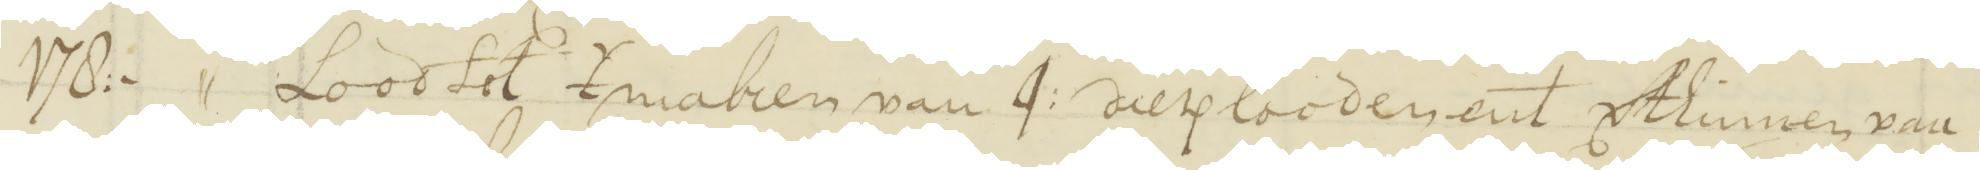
178:- „ Lood tot 'tmaken van 4: dieplooden ent verthinnen van
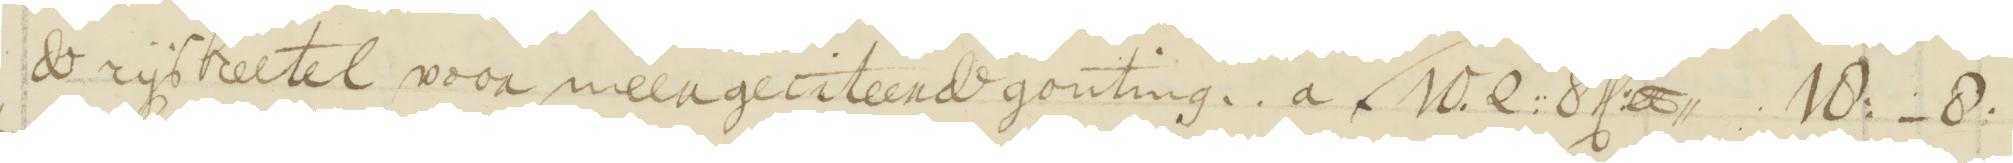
de rijskeetel voor meergeciteerde gonting, . a ƒ10.2:8 'tC:to lb„ 18: - 8:
